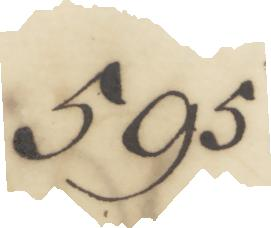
595
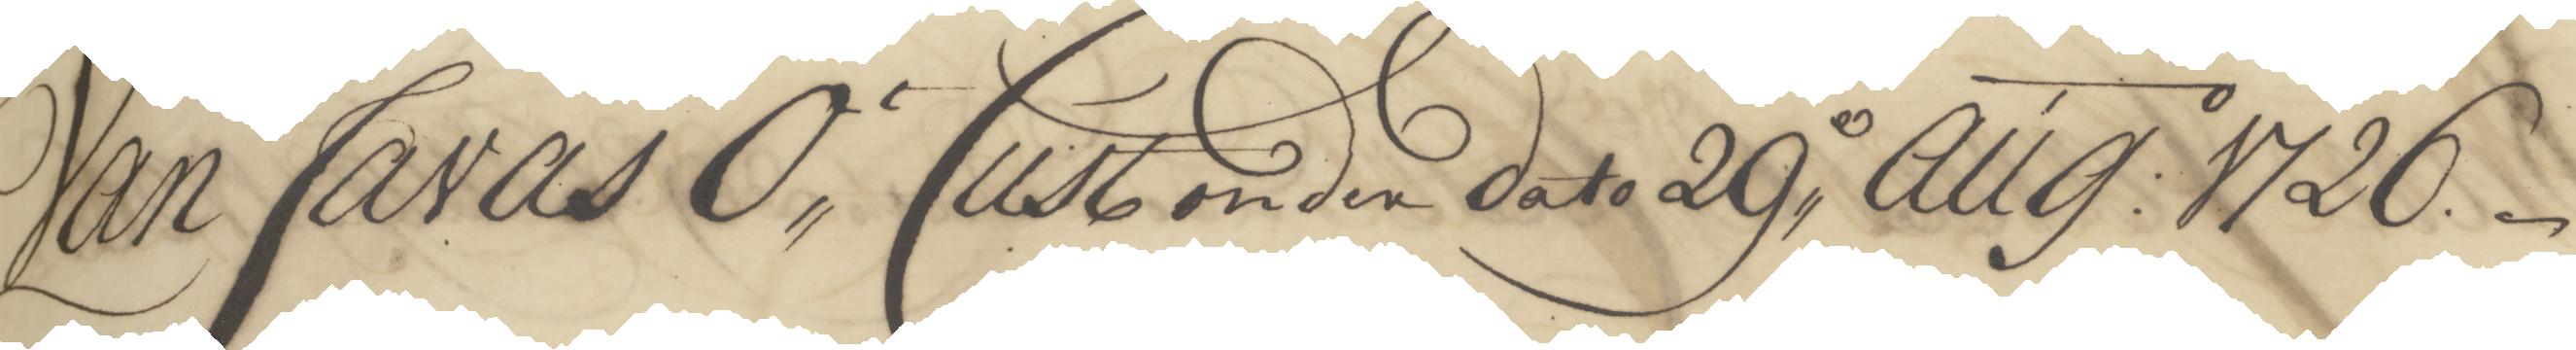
Van Java's O„t Cust onder dato 29„e Aug:o 1726. —
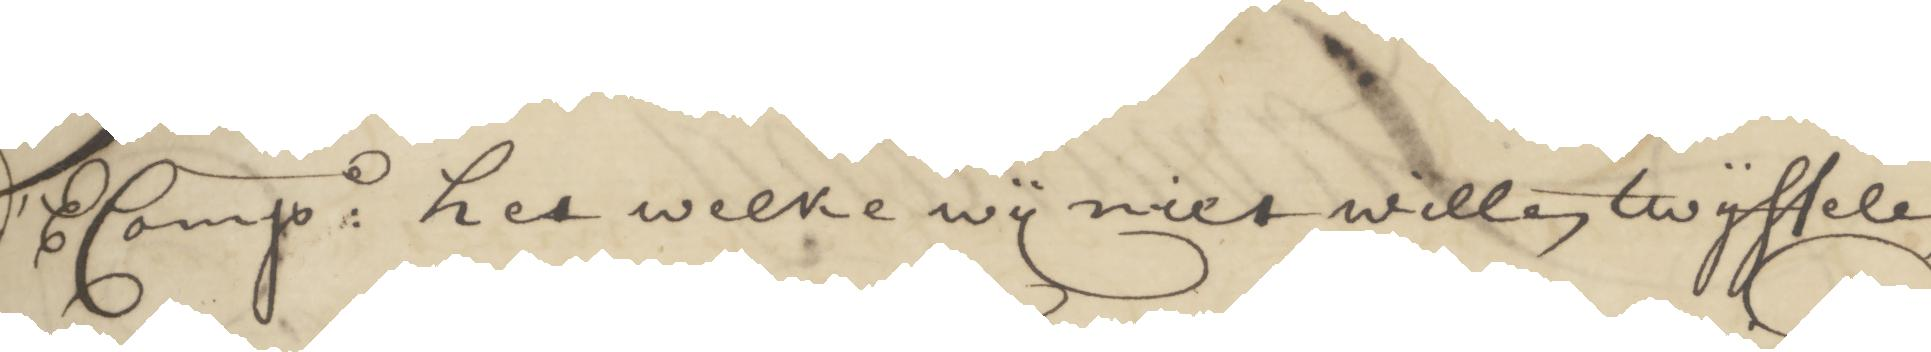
d' E Comp:e het welke wij niet willen twijffelen
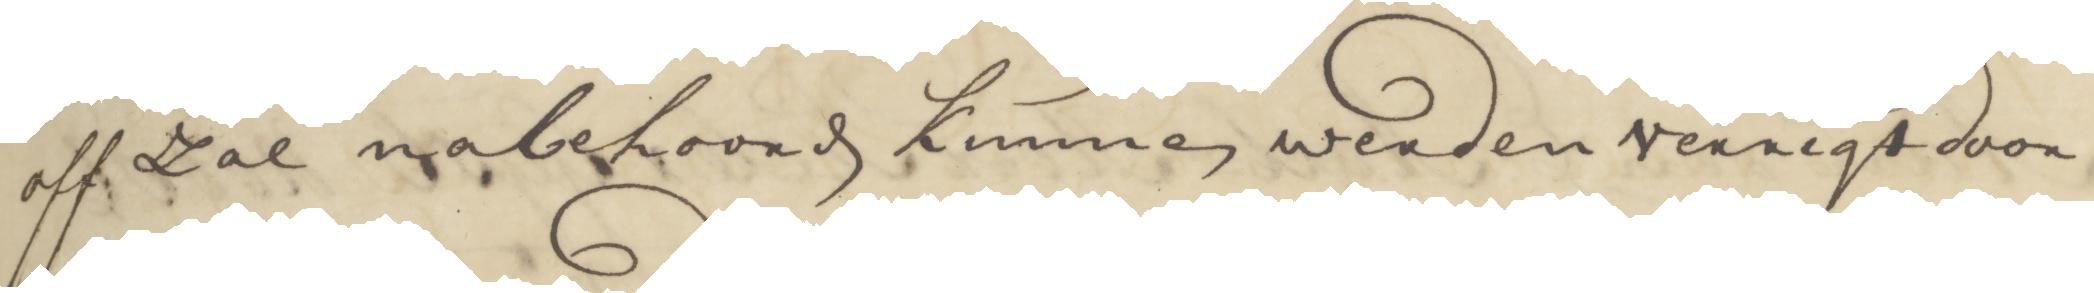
off zal nabehooren kunnen werden verrigt door
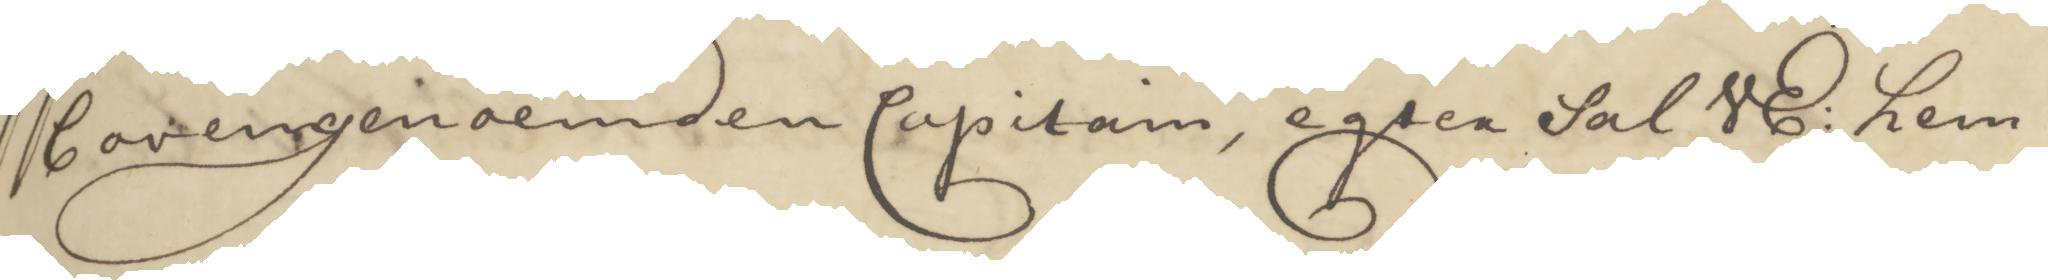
bovengenoemden Capitain, egter sal VE: hem
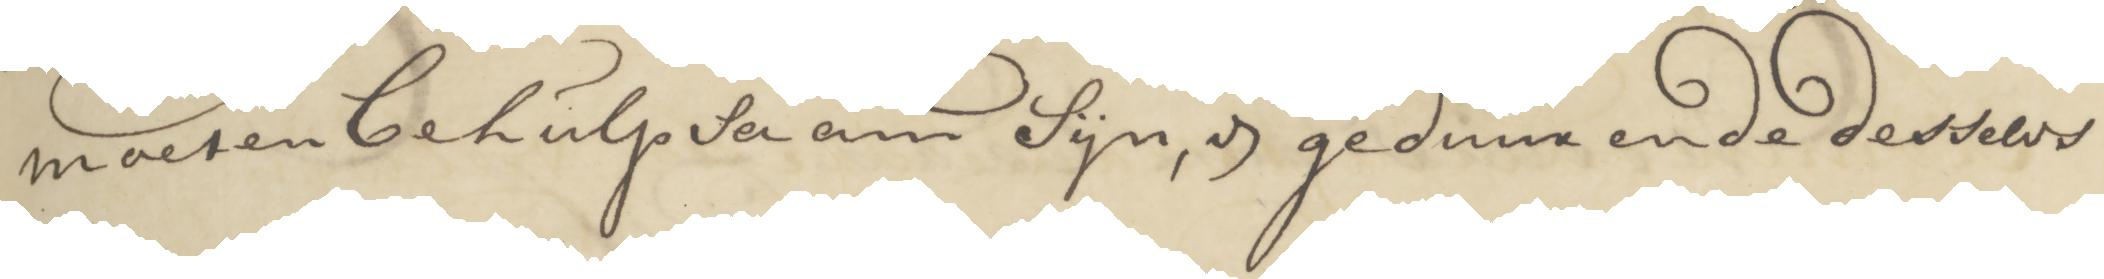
moeten behulpsaam sijn, en geduur ende desselvs
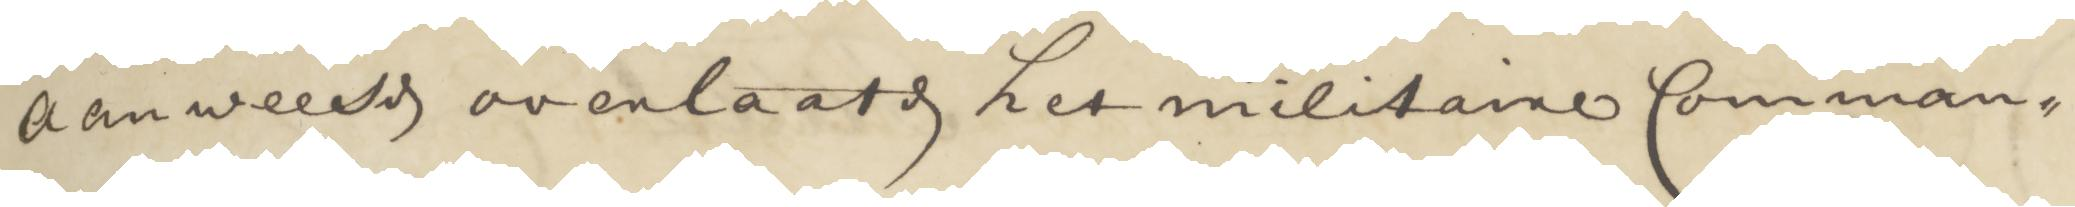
aanweesen overlaaten het militaire Comman„
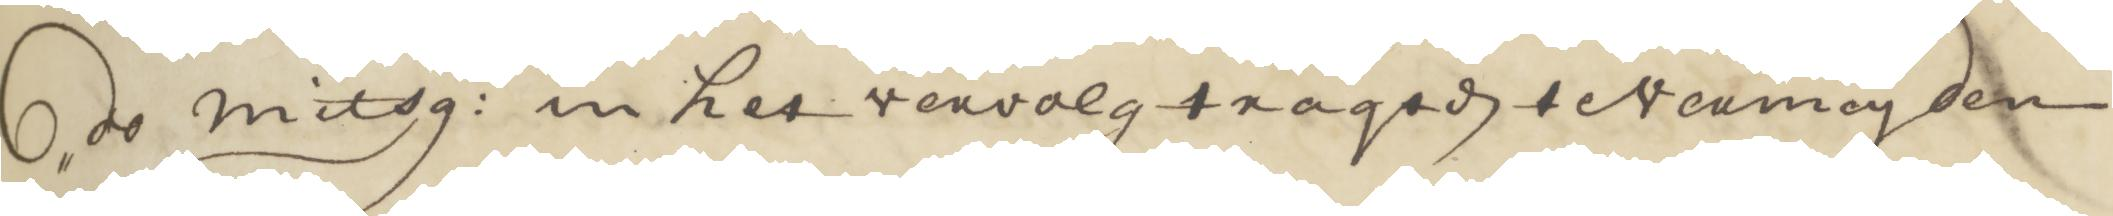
„do mitsg:s in het vervolg tragten te vermeijden
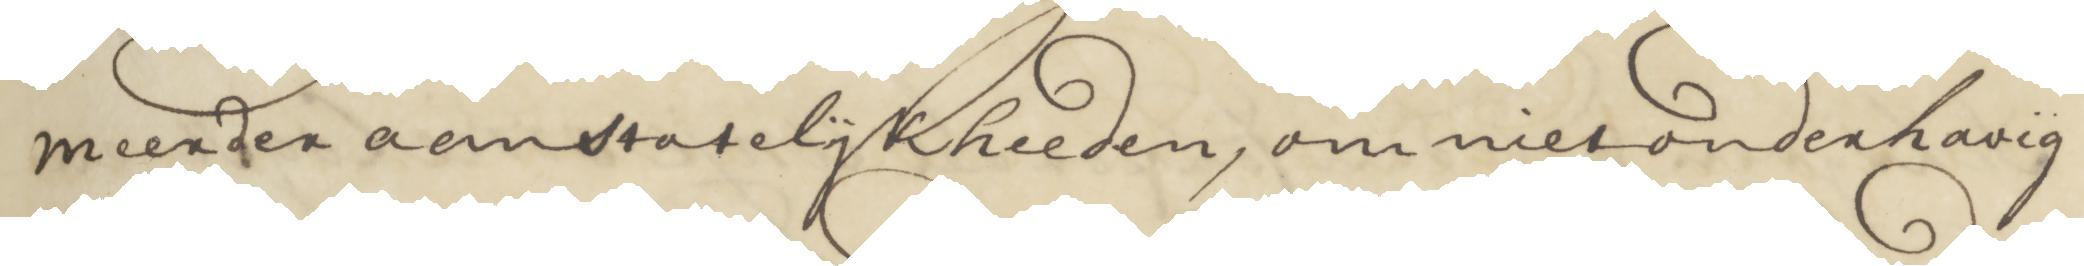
meerder aanstatelijkheeden, om niet onderhavig
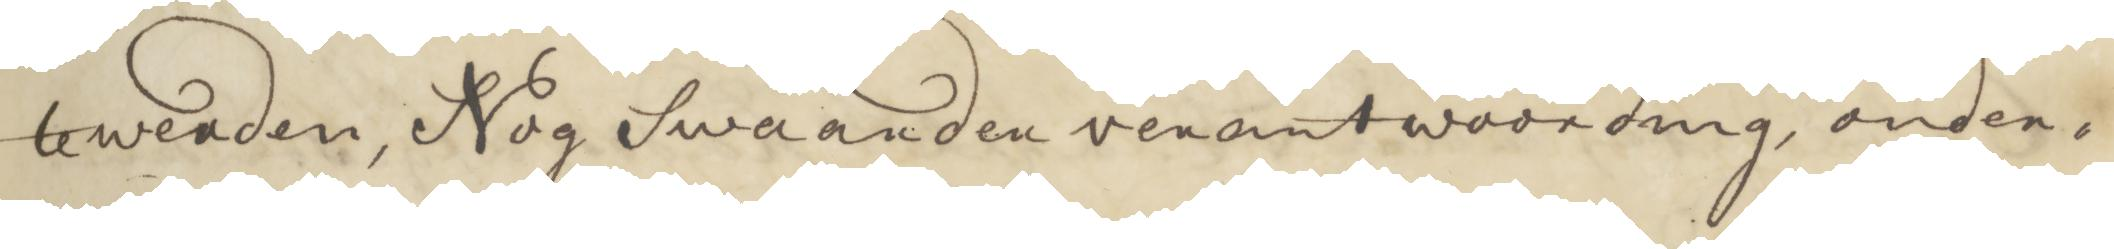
te werden, Nog swaarder verantwoording, onder„
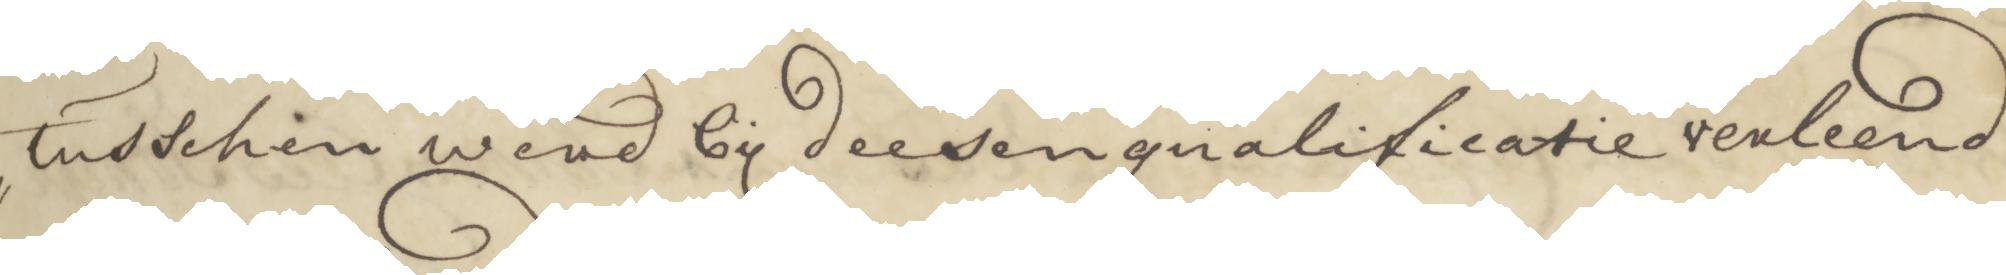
„tusschen werd bij deesen qualificatie verleend
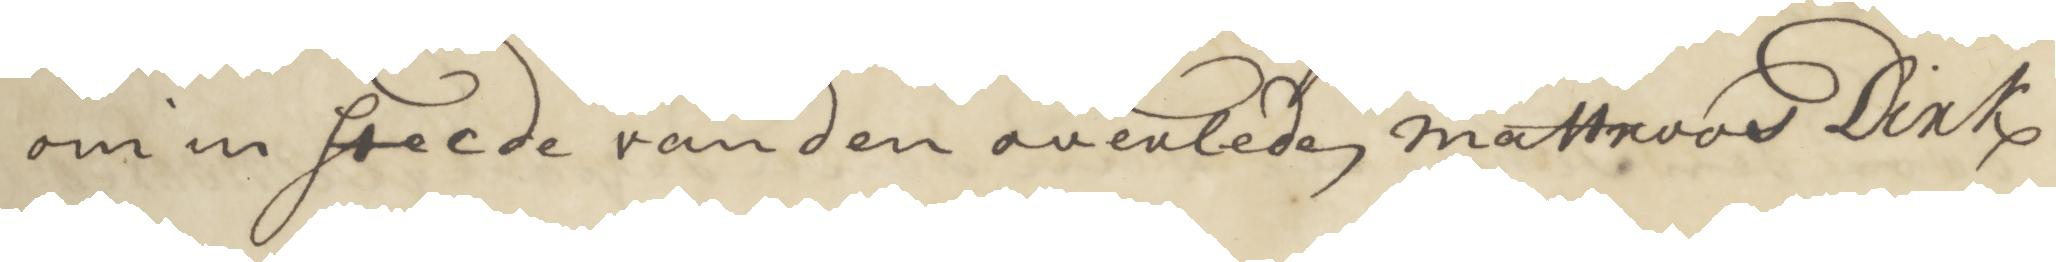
om in steede van den overleden mattroos Dirk
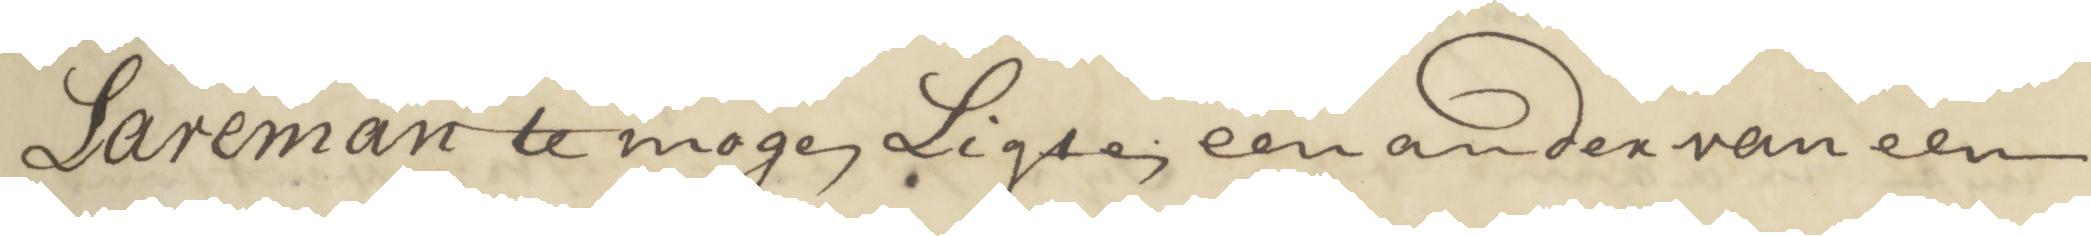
Lareman te mogen Ligten een ander van een
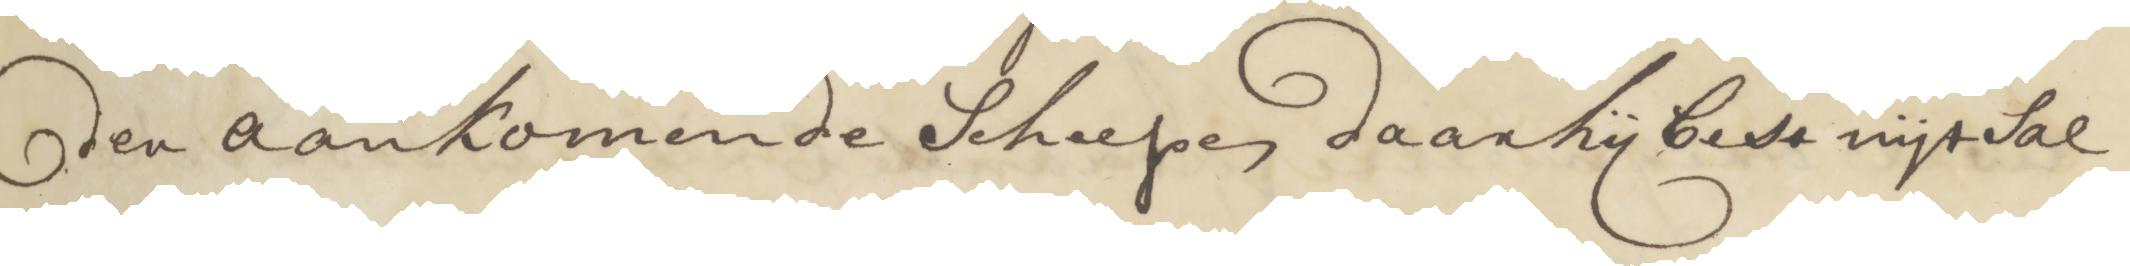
der aankomende scheepen daar hij best uijt sal
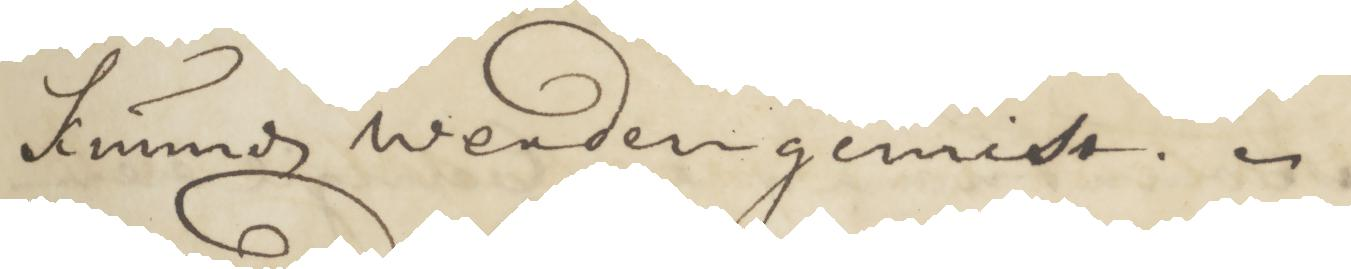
kunnen werden gemist. —.
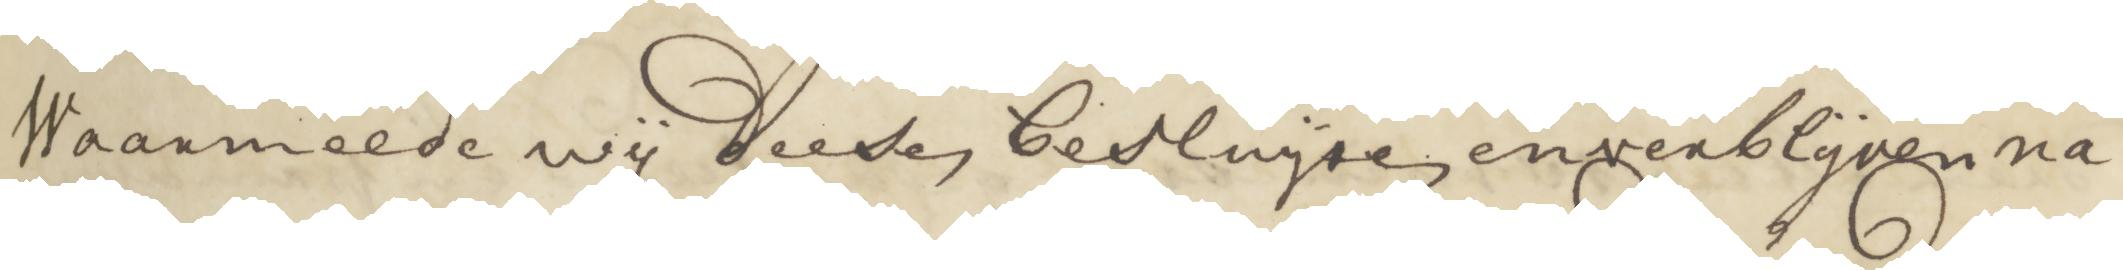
Waarmeede wij deesen besluijten en verblijven na
